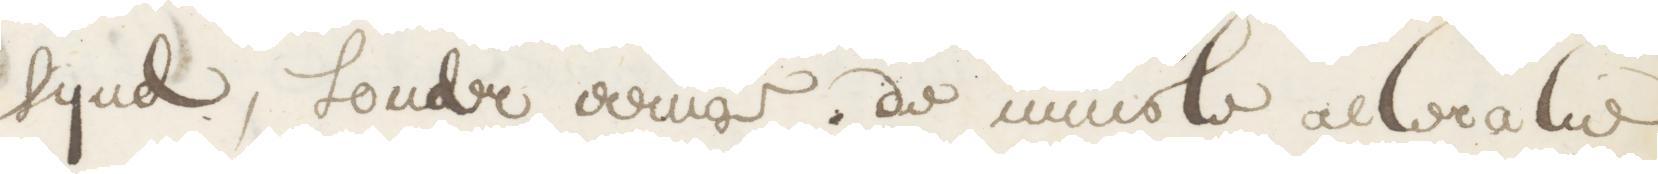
sijnde, sonder eenige de minste alteratie
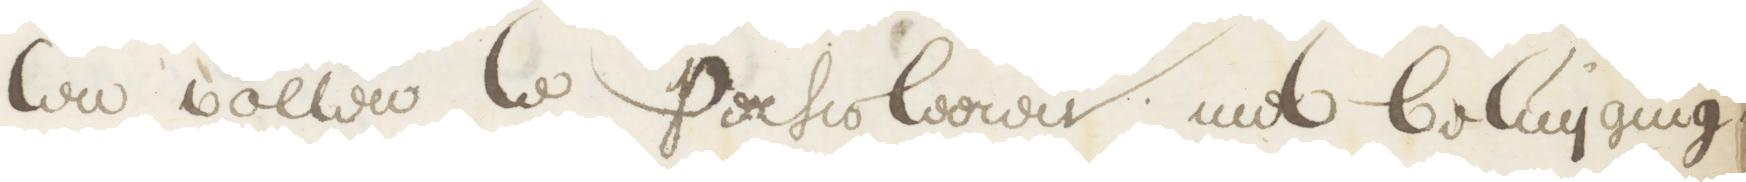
ten vollen te Persisteeren:, met betuijging
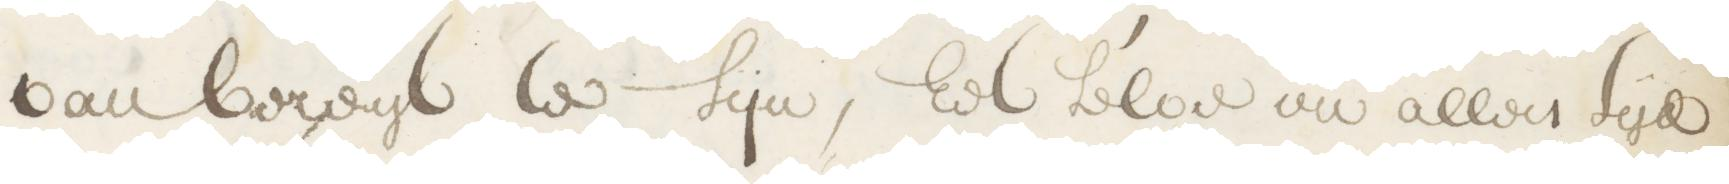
van bereijt te sijn, het selve en allen tijde
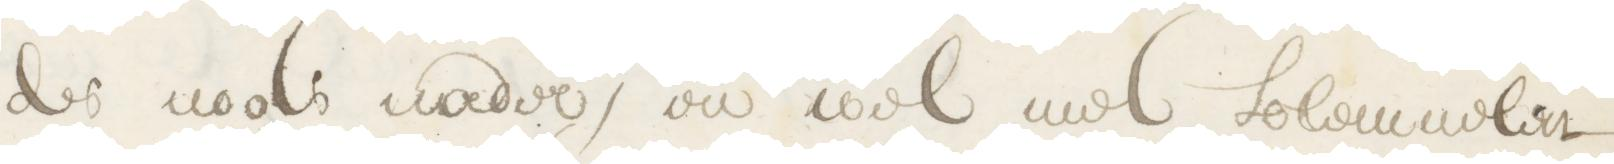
des noots nader, en wel met solemnelen
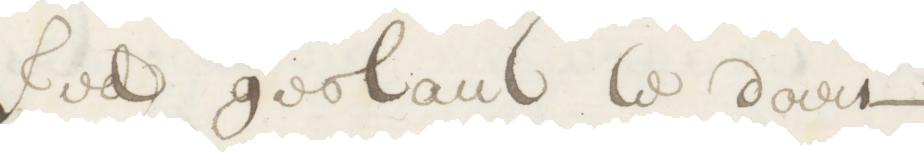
Eed gestant te doen
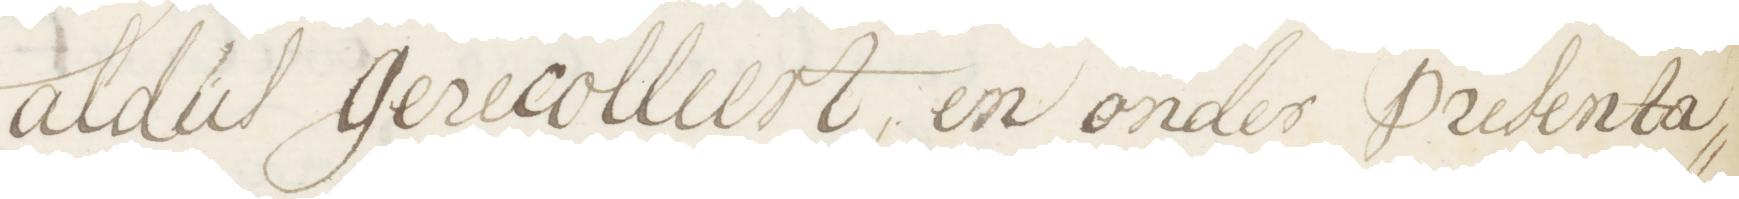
aldus gerecolleert, en onder presenta„
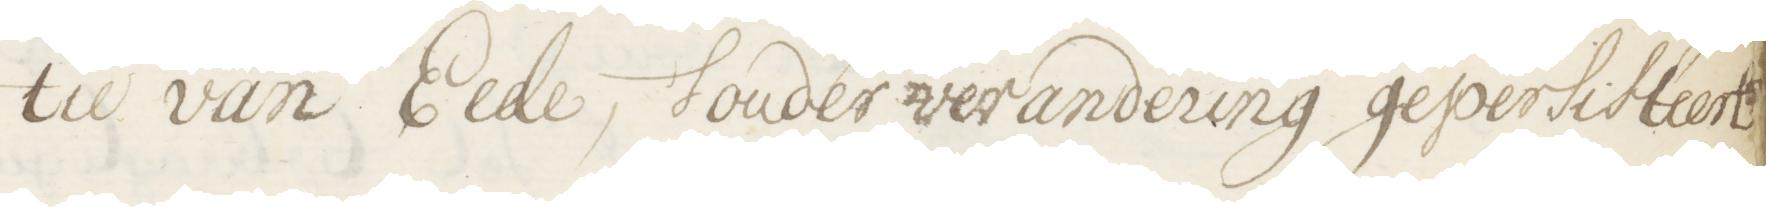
tie van Eede, sonder verandering gepersisteert
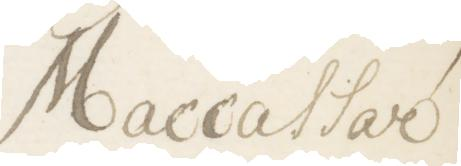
Maccassar
